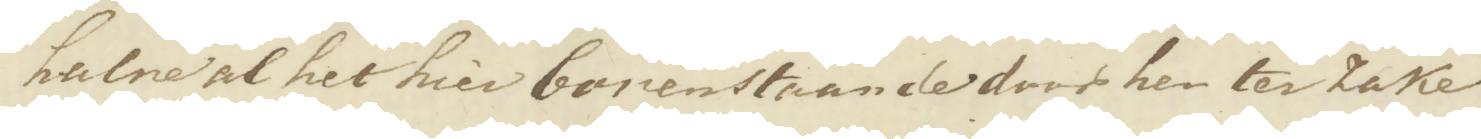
halve al het hier bovenstaande door her ter zake
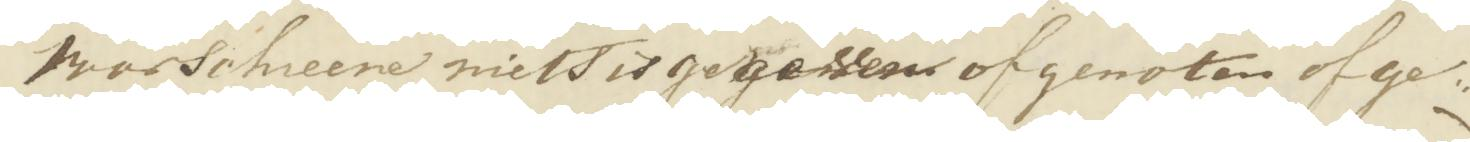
voorschreeve niets is gegeven of genoten of ge„
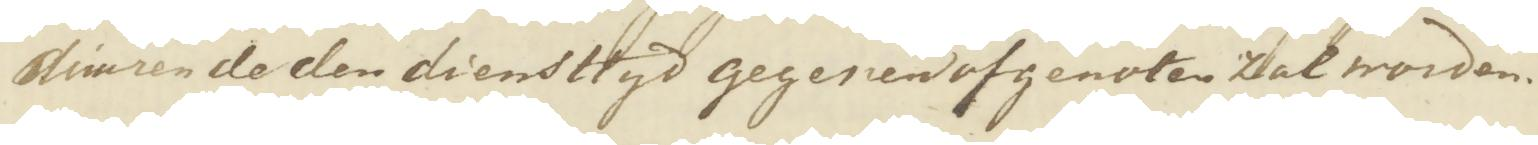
duurende den diensttijd gegeven of genoten zal worden.
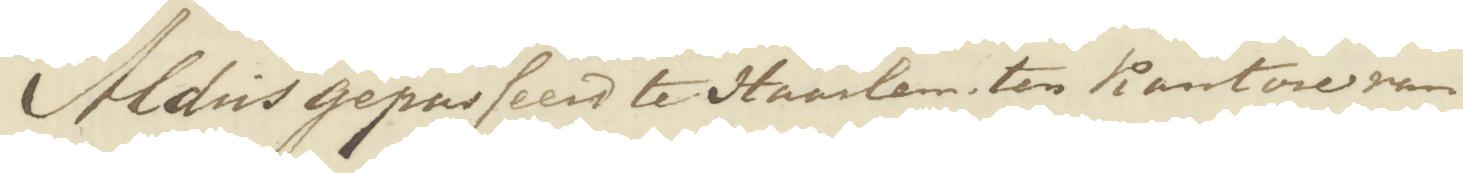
Aldus gepasseerd te Haarlem, ten Kantore van
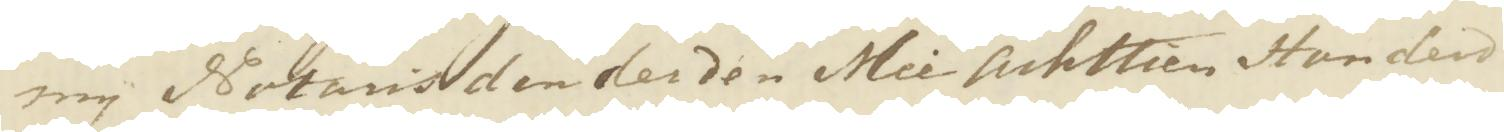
mij Notaris den derden Mei achttien Honderd
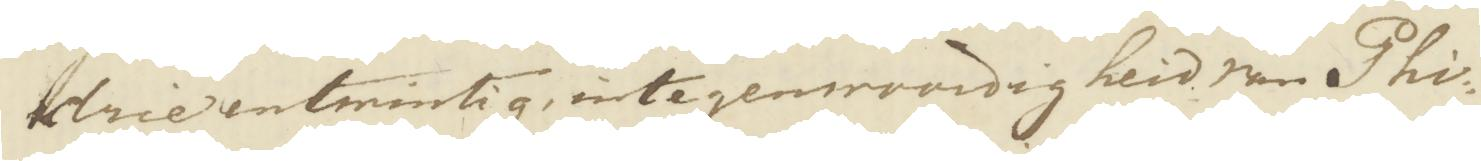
drie en twintig, in tegenwoordigheid van Phi„
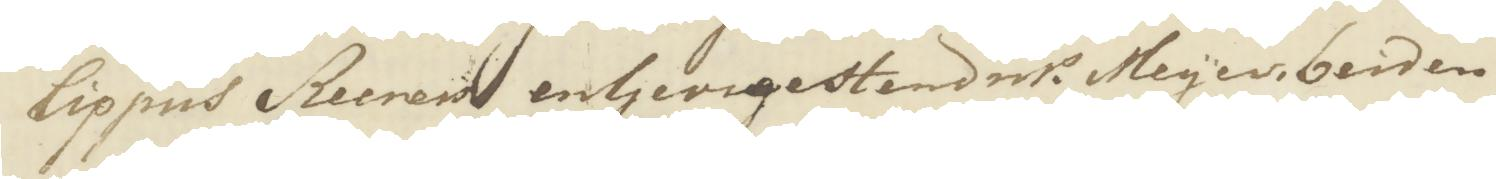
lippus Reevers en George Hendrik Meijer, beiden
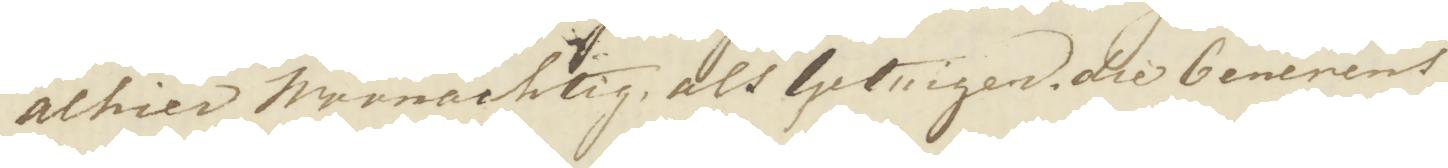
alhier woonachtig, als Getuigen, die benevens
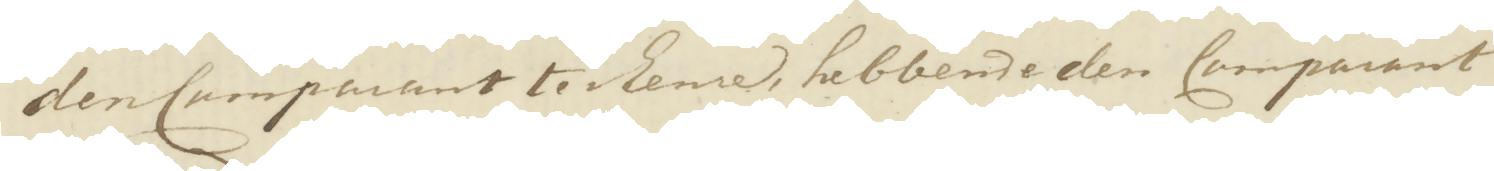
den Comparant ter Eenre, hebbende den Comparant
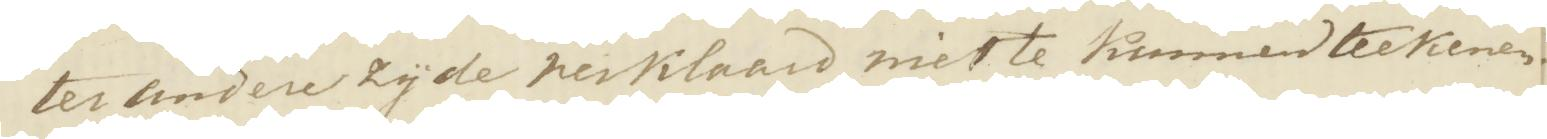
ter andere zijde verklaard niet te kunnen teekenen,
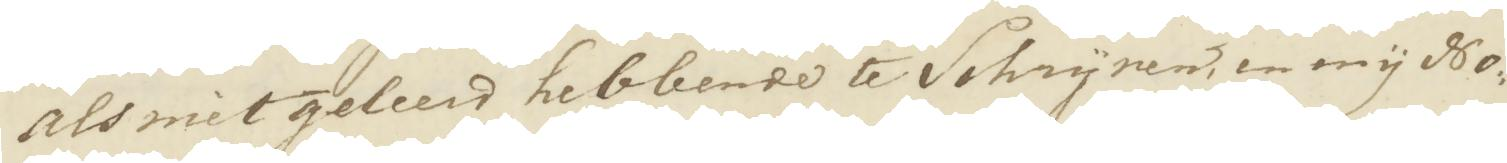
als met geleerd hebbende te schrijven, en mij No„
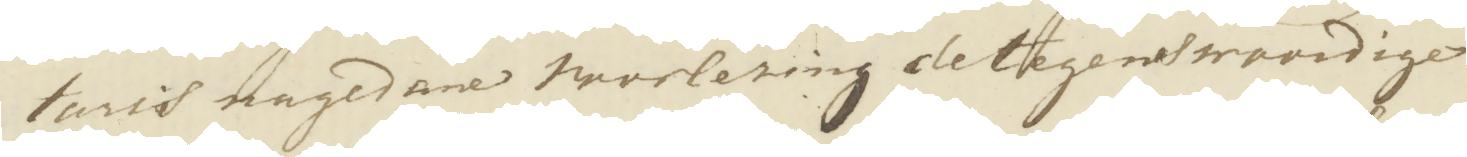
taris nagedane voorlezing de tegenswoordige
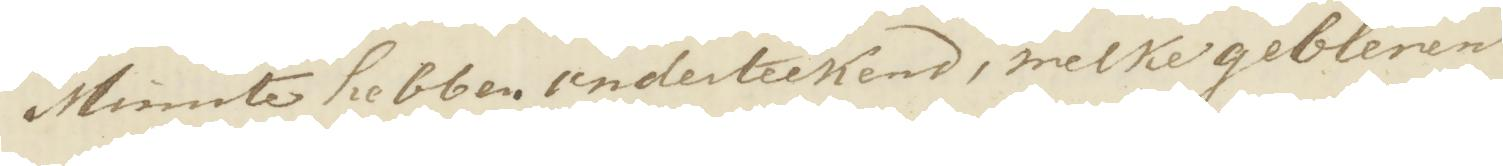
Minute hebben onderteekend, welke gebleven
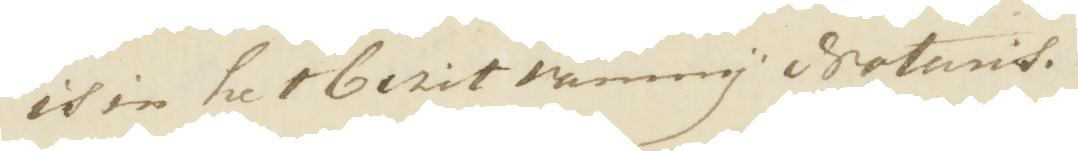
is in het bezit van mij Notaris.
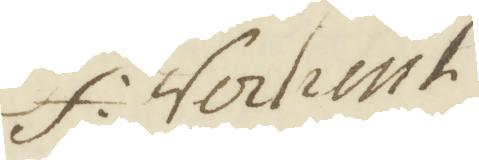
F: Verkeul
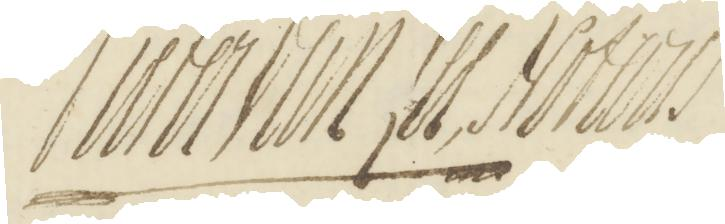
Pieter van Lée, Notaris
